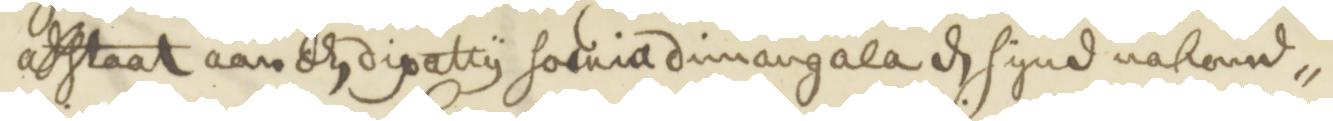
afstaat aan den dipattij Soeria dimangala en sijne nakome„
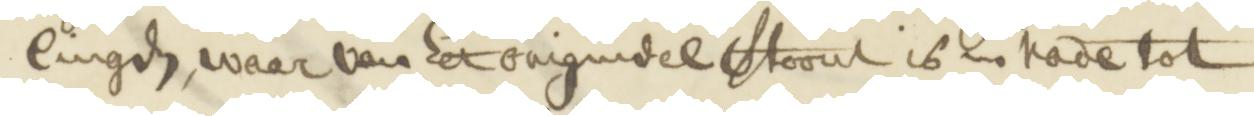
lingen, waar van het origineel vertoont is in rade tot
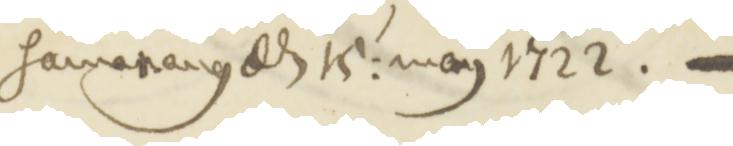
Samarang den 15:' maij 1722. —
